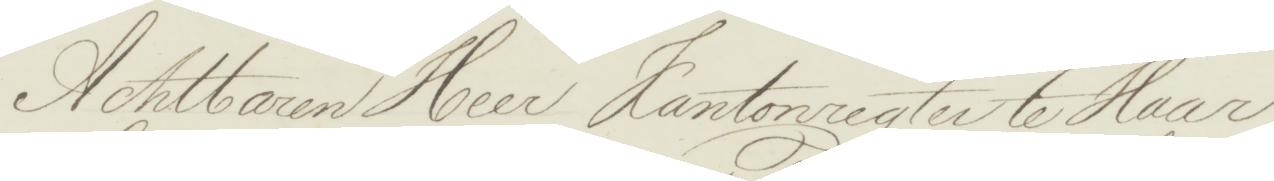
Achtbaren Heer Kantonregter te Haar
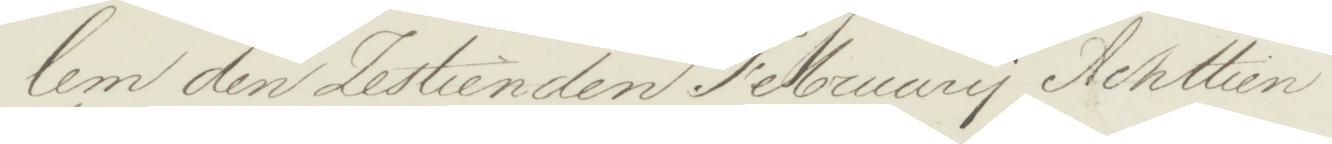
lem den Zestienden Februarij Achttien
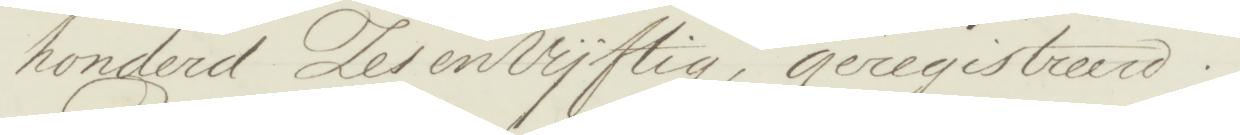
honderd Zes en vijftig, geregistreerd.
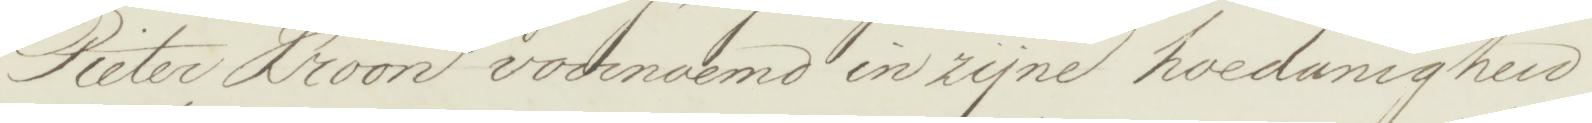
Pieter Kroon voornoemd in zijne hoedanigheid
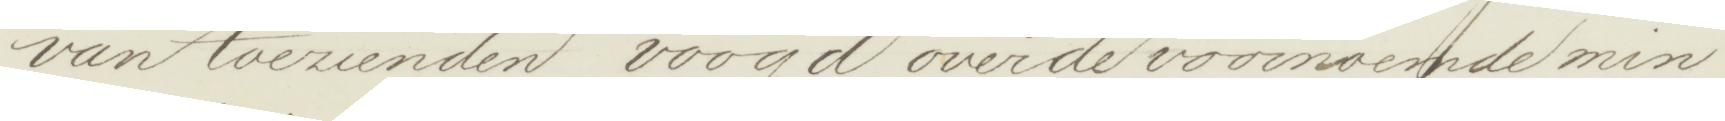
van toezienden voogd over de voornoemde min
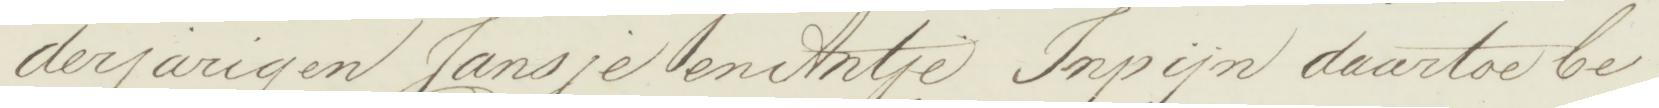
derjarigen Jansje en Antje Inpijn daartoe be
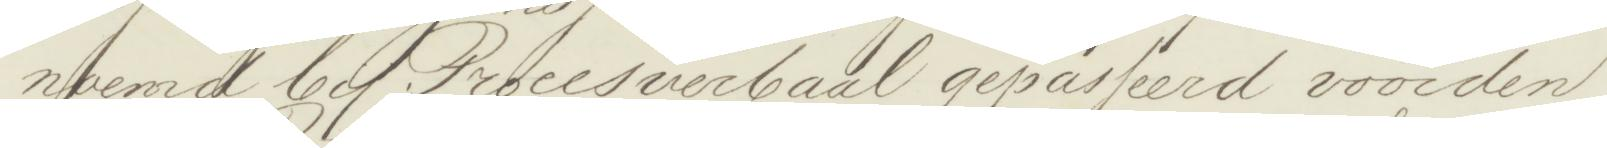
noemd bij Proces verbaal gepasseerd voor den
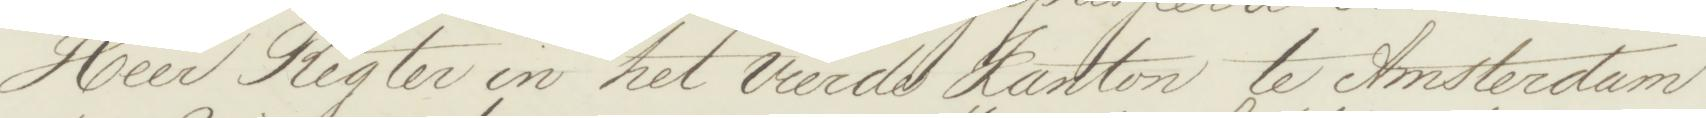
Heer Regter in het vierde Kanton te Amsterdam
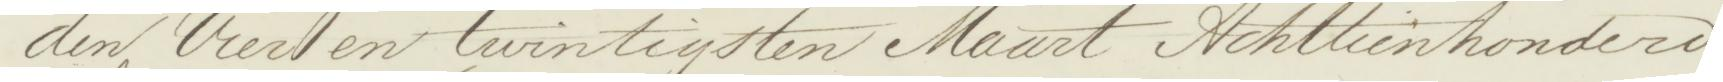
den Vier en twintigsten Maart Achttienhonderd
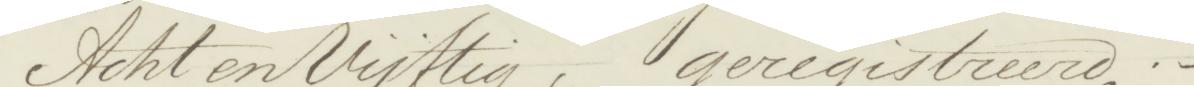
Acht en Vijftig, geregistreerd.
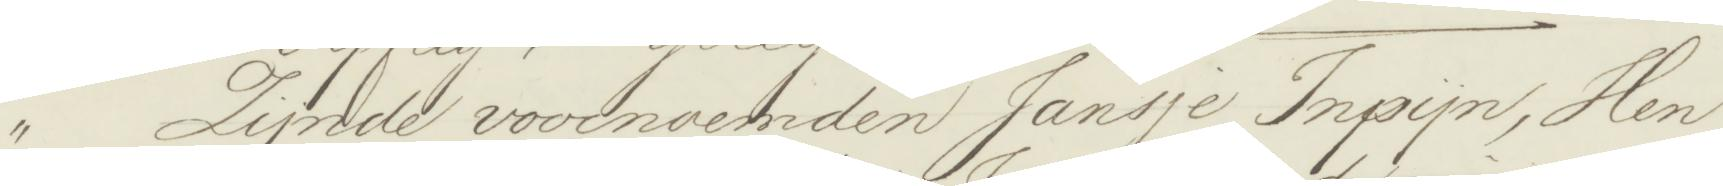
„ Zijnde voornoemden Jansje Inpijn, Hen
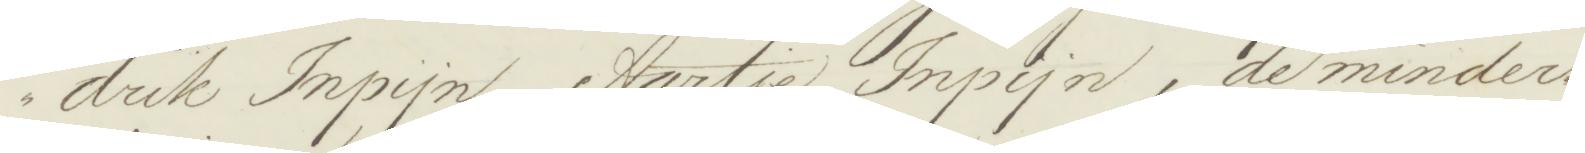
„ „drik Inpijn Aartje Inpijn, de minder„
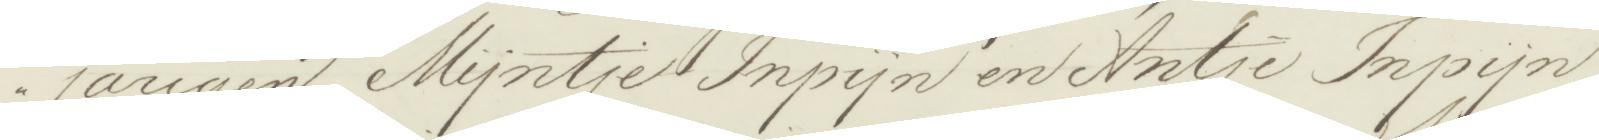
„ „jarigen Mijntje Inpijn en Antje Inpijn,
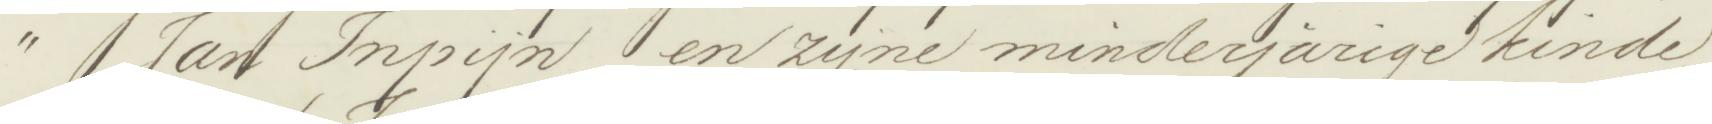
„ Jan Inpijn en zijne minderjarige kinde
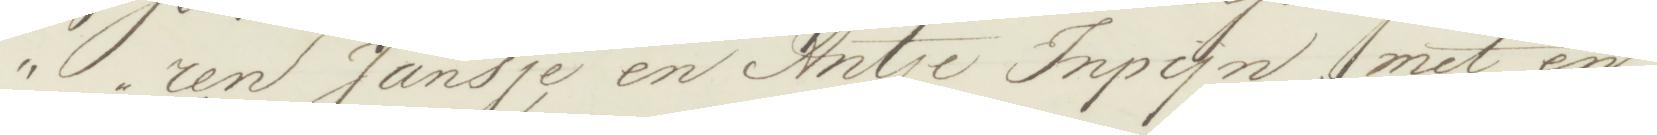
„ „ren Jansje en Antje Inpijn met en
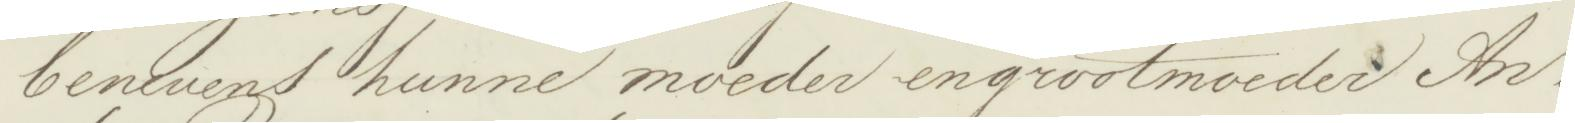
benevens hunne moeder en grootmoeder An„
